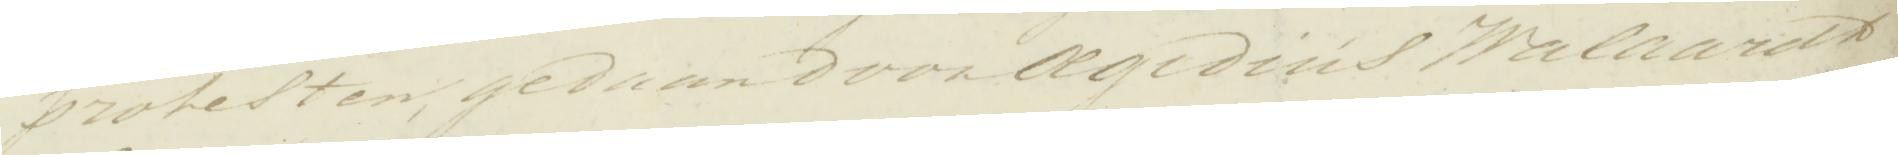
protesten, gedaan door AEgidius Walaardt
